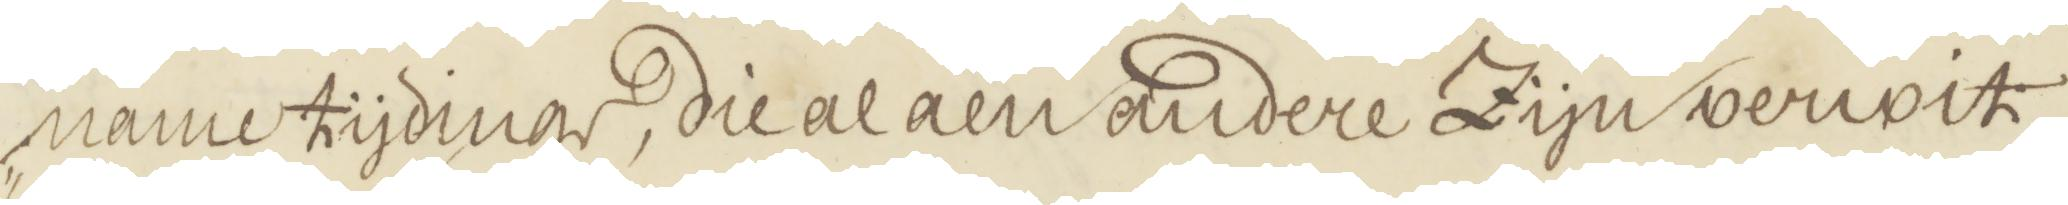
„name tijdinge, die al aen andere zijn verwit
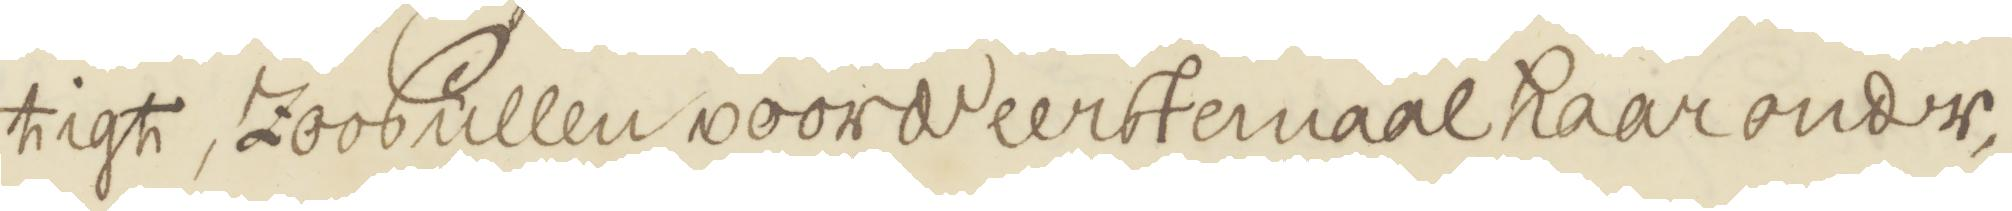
tigt, zoo sullen voor de eerstemaal haar onder„
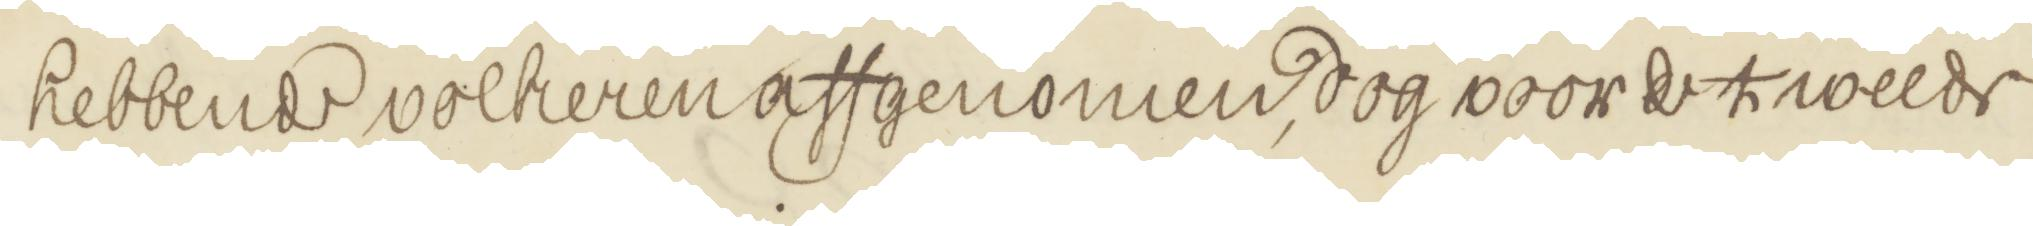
hebbende volkeren affgenomen, dog voor de tweede
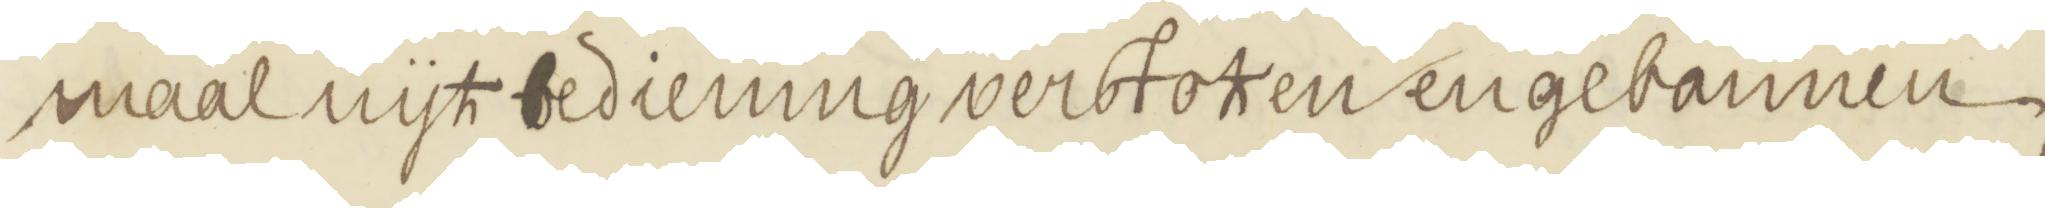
maal uijt bediening verstoten en gebannen
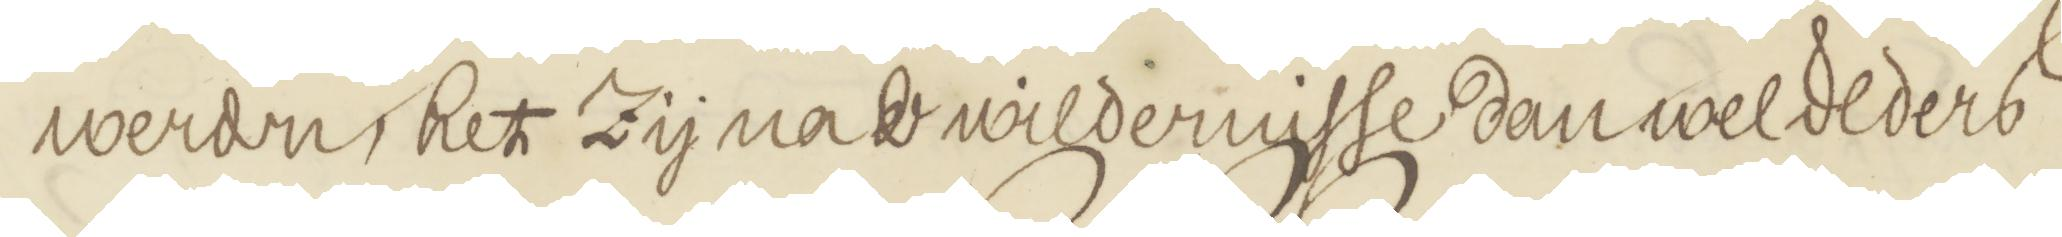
werden, het zij na de wildernisse dan wel Elders
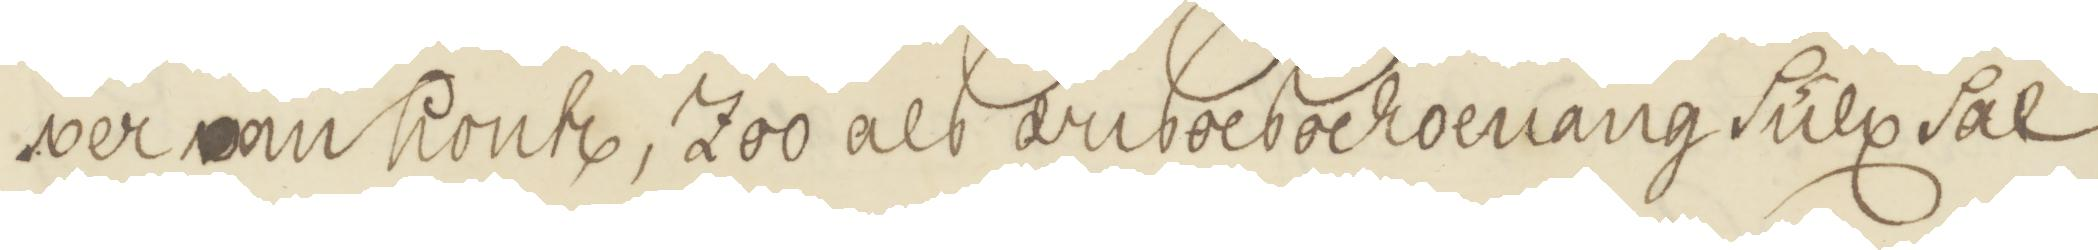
ver van honk, zoo als den soesoehoenang sulx sal
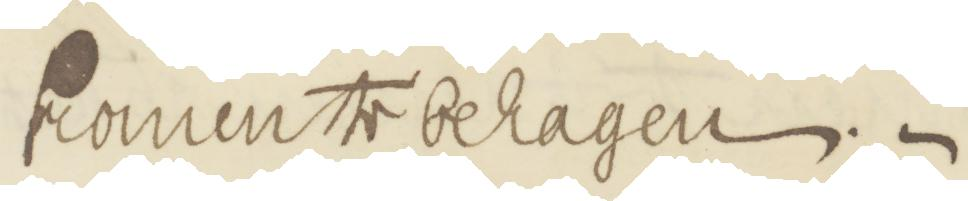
komen te behagen. —
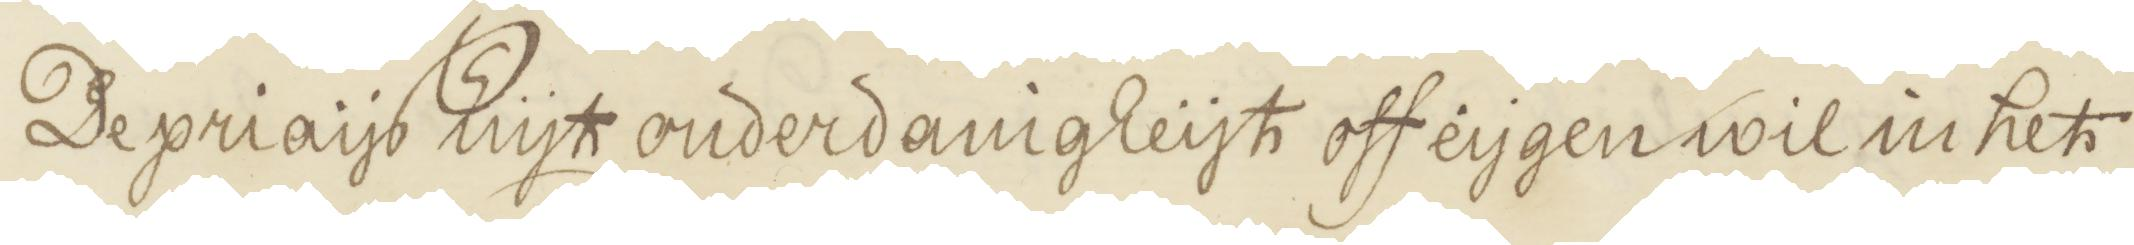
De priaijs uijt onderdanigheijt off eijgen wil in het
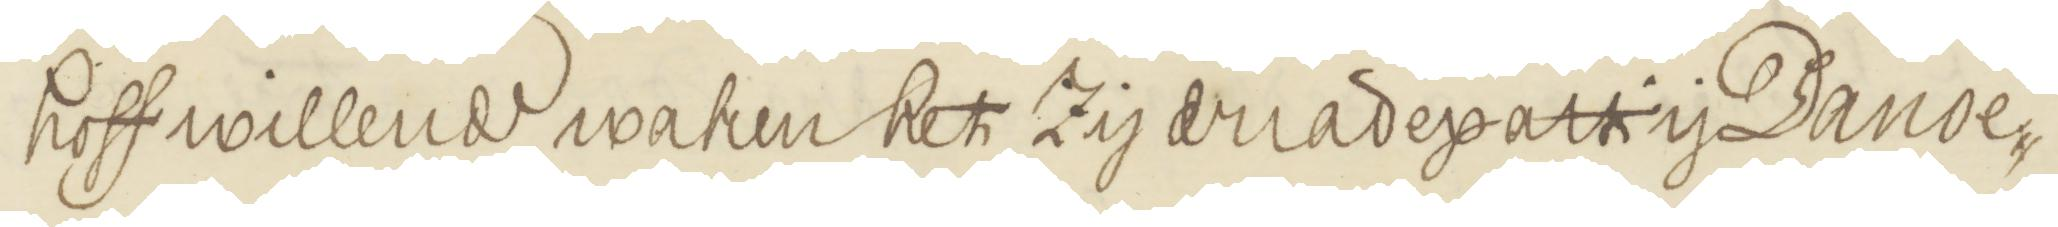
hoff willende waken het zij den adepattij Danoe„
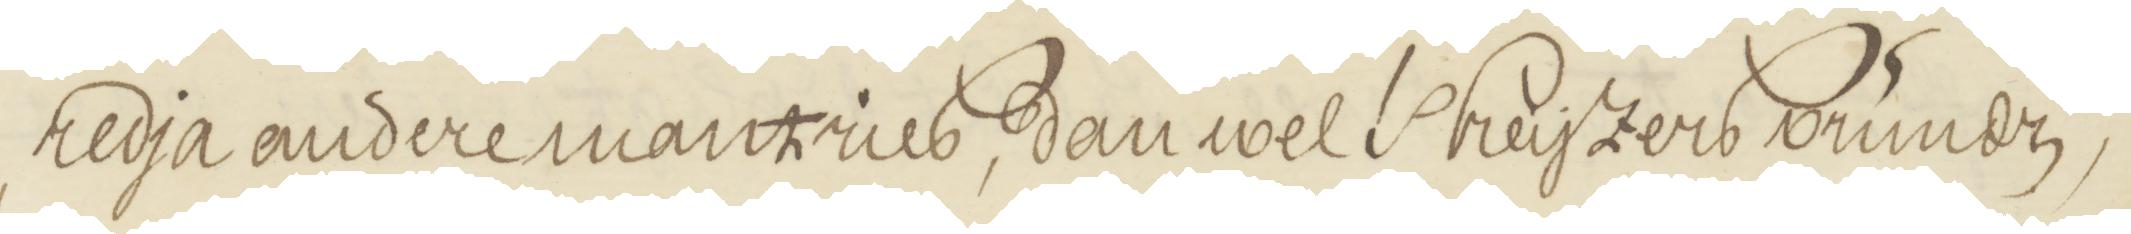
redja andere mantries, dan wel 's keijzers vrunden,
